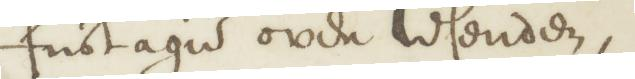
fustagie over tesenden,
